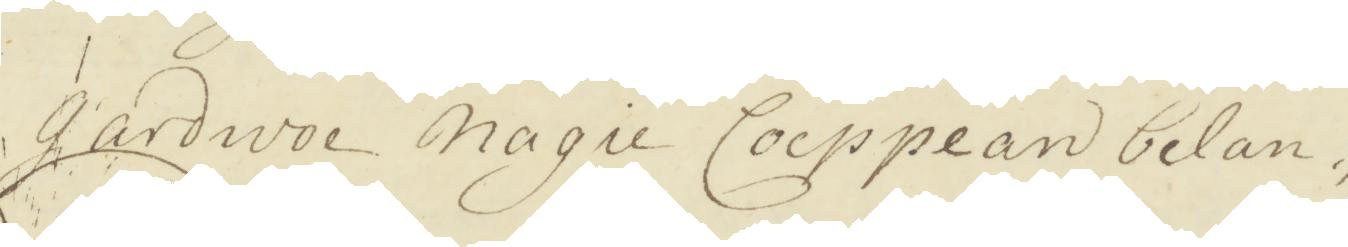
gardwoe nagie Coeppean belan„
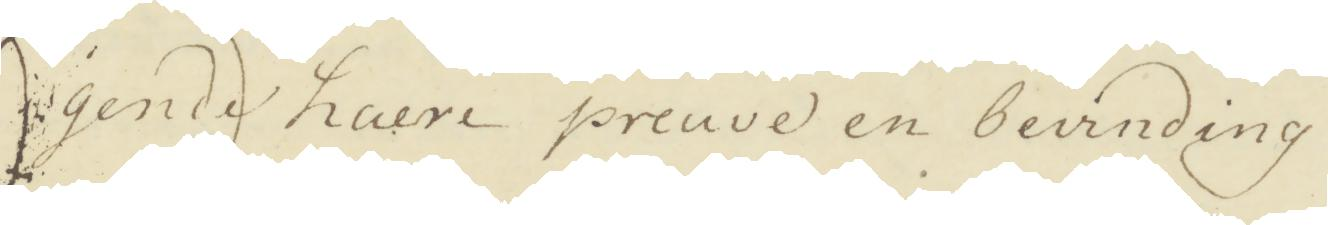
„gende haere preuve en bevinding
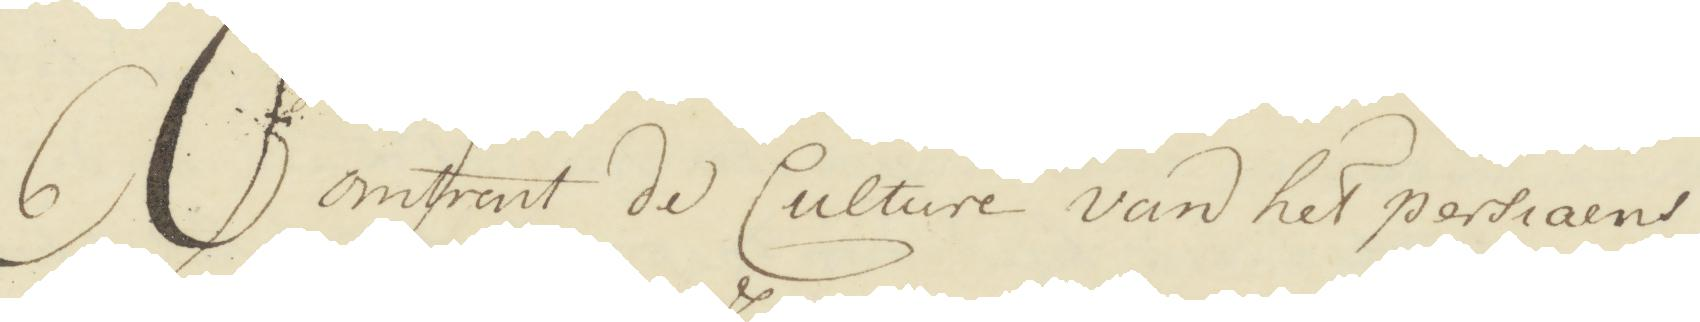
omtrent de Culture van het persiaens
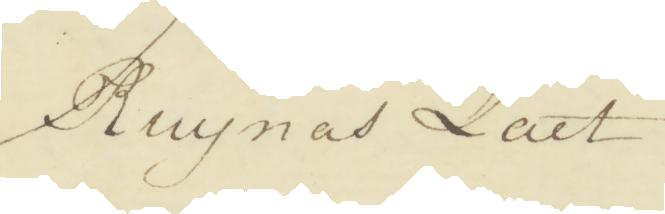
Ruijnas Zaet
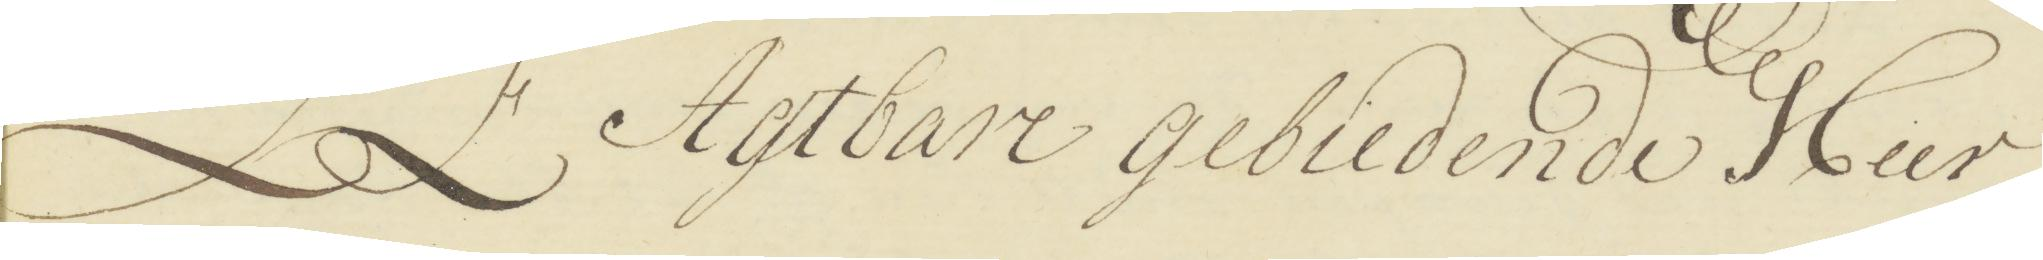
E E Agtbare gebiedende Heer
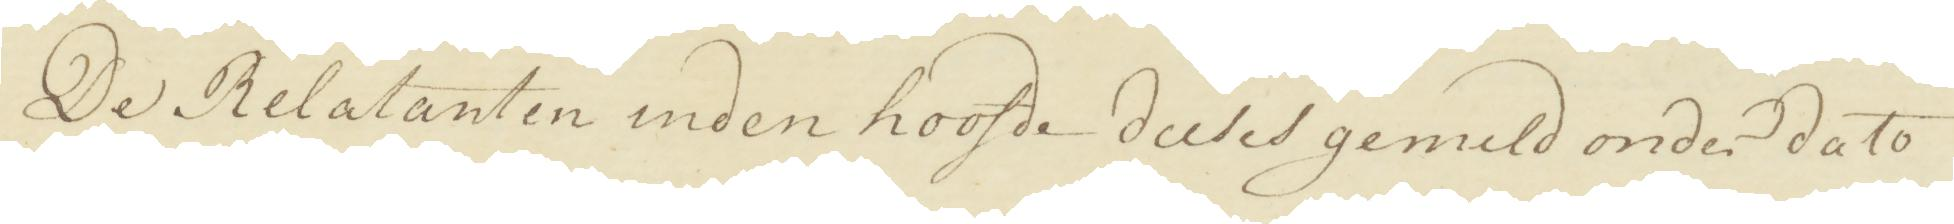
De Relatanten inden hoofde deeses gemeld onder dato
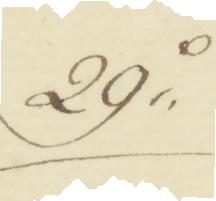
29„e
